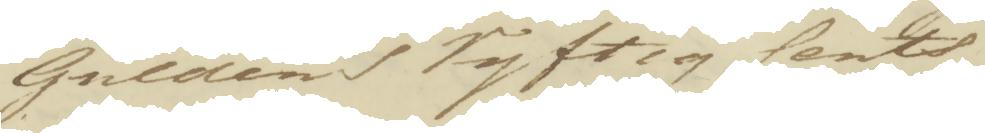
Guldens Vijftig Cents
